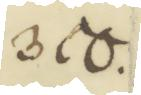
350.
